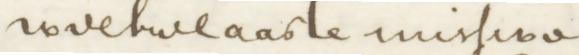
welke laaste missive
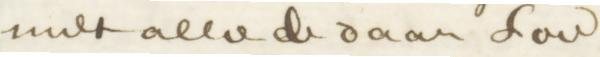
met alle de daar toe
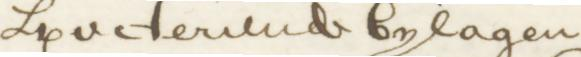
specterende bijlagen
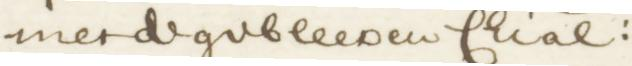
met de gebleeven Chial:
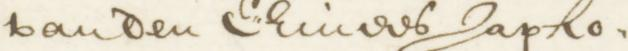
van den Chinees Japko„
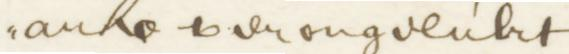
„anko verongelukt
